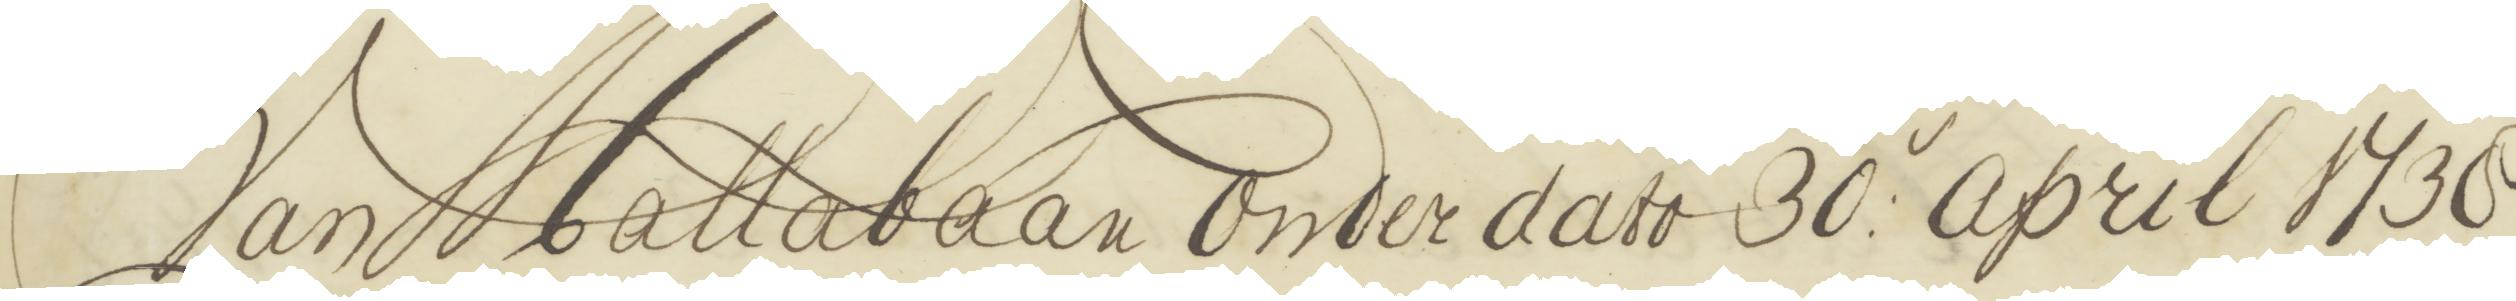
Van Mallabaar onder dato 30:~ april 1738
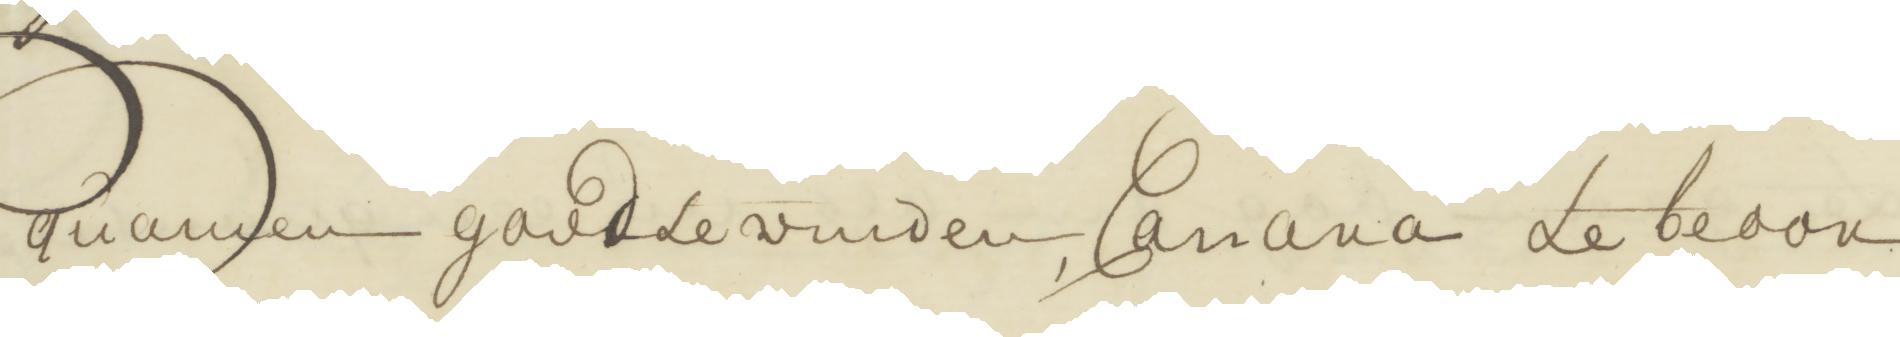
quamen goed te vinden, Canara te beoor„
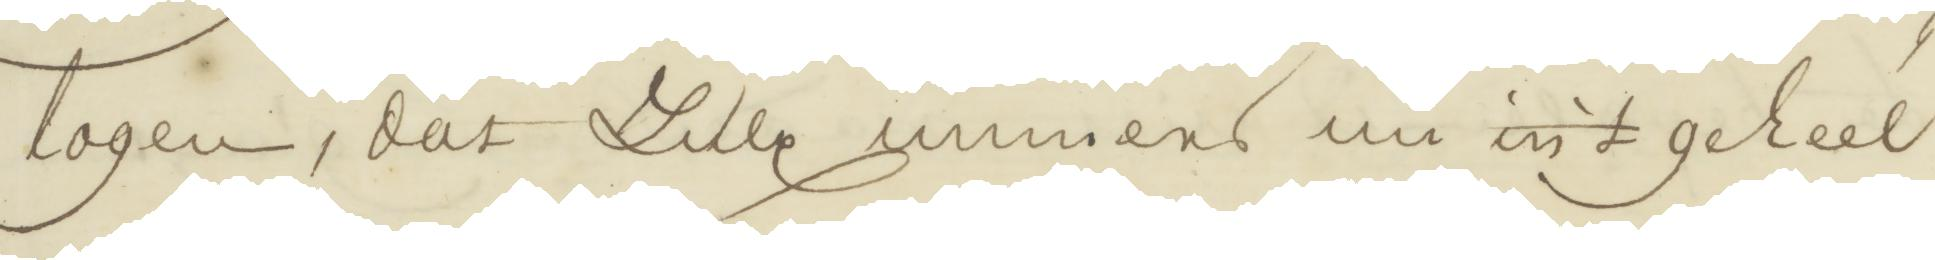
logen, dat zulx immers nu in ’t geheel
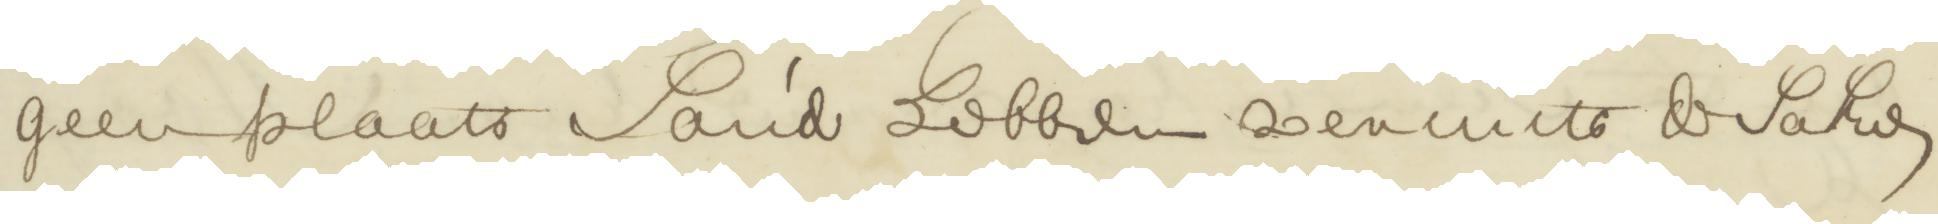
geen plaats soude hebben vermits de saken
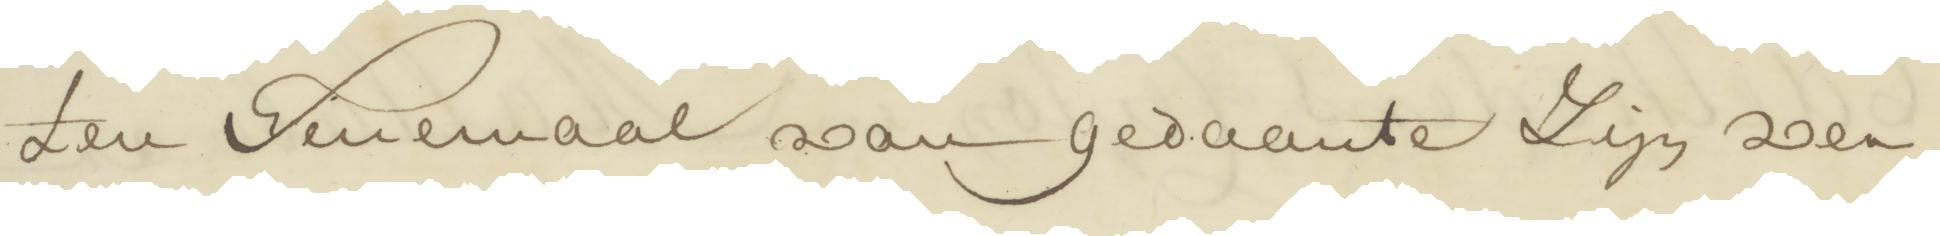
ten Eenemaal van gedaante zijn ver
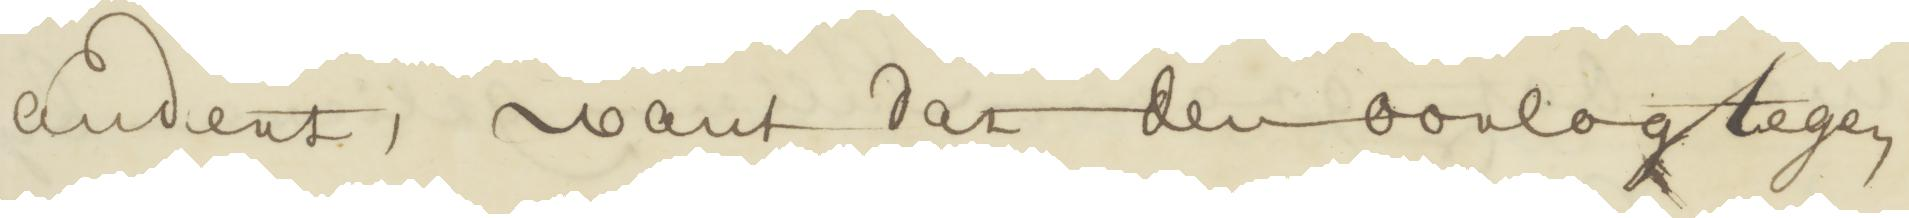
andert, want dat den oorlog tegen
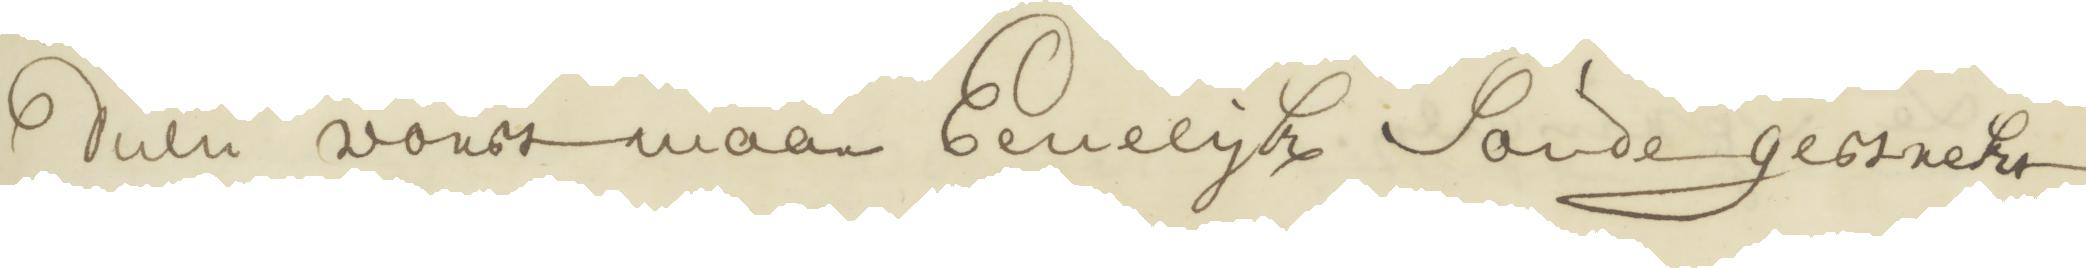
dien vorst maar Eenelijk soude gestrekt
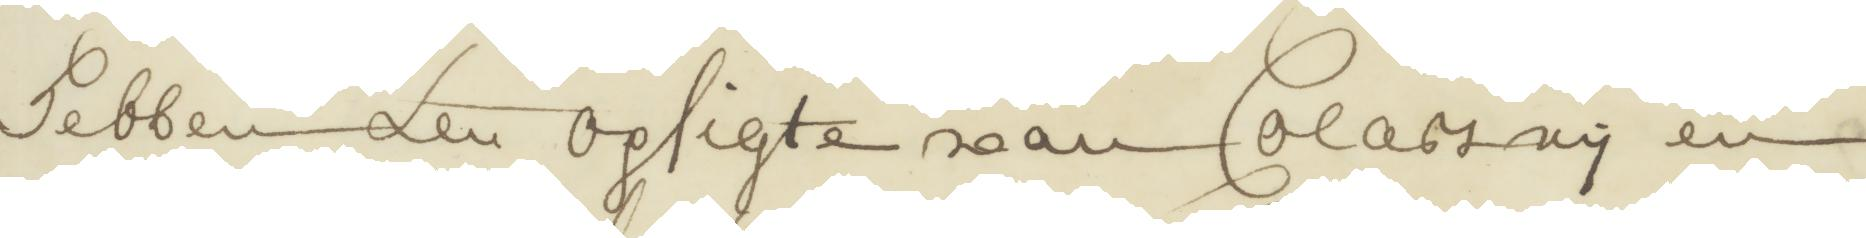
hebben ten opsigte van Colastrij en
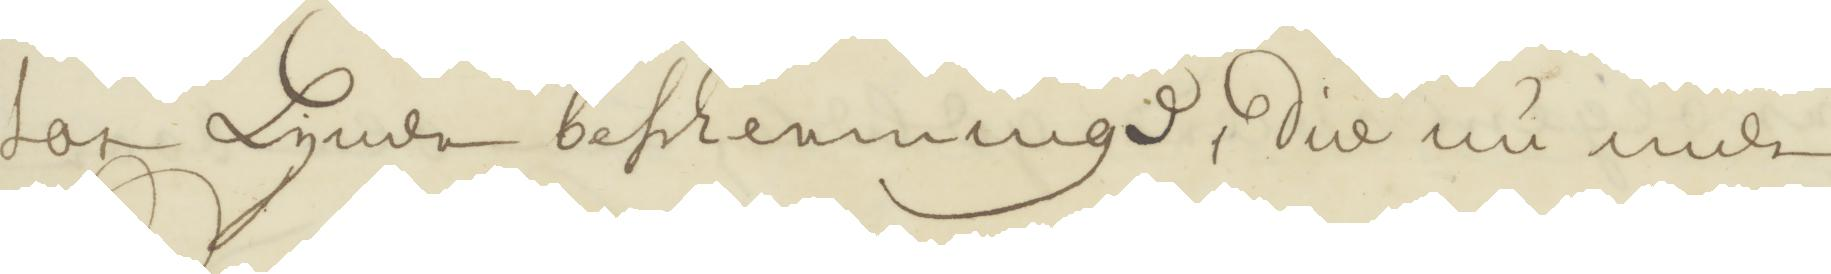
tot zijner bescherminge, die nu met
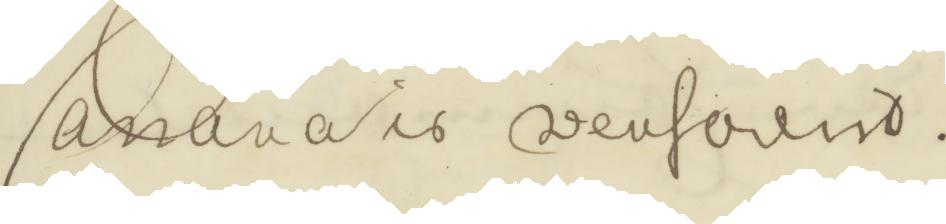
Canara is versoend.
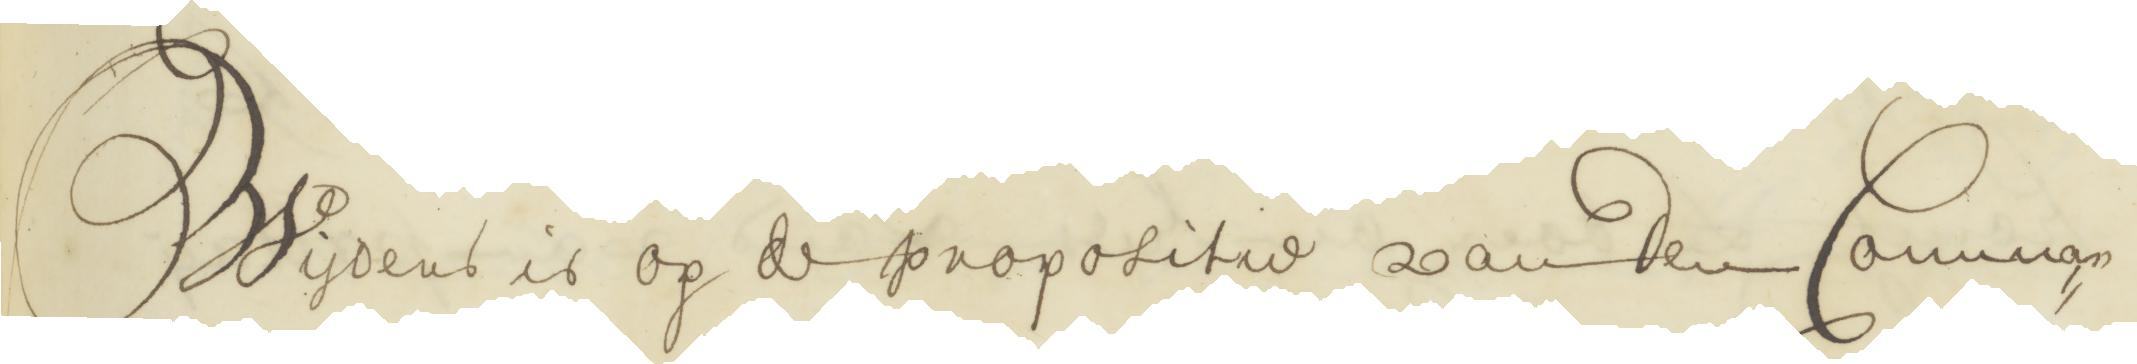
Wijders is op de propositie van den Comman„
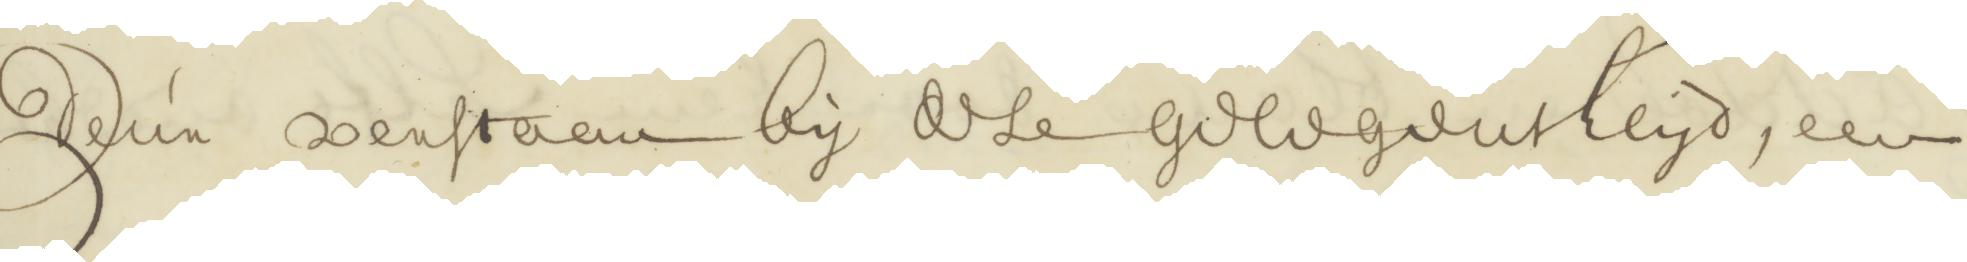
deur verstaan bij dese gelegentheijd, een
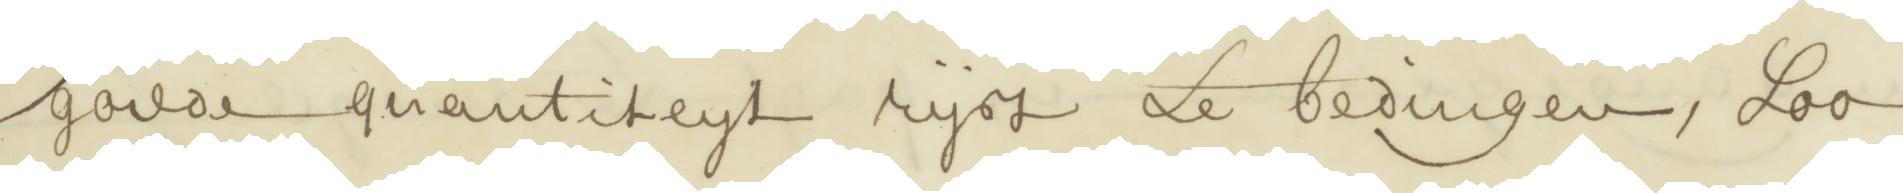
goede quantiteijt rijst te bedingen, soo
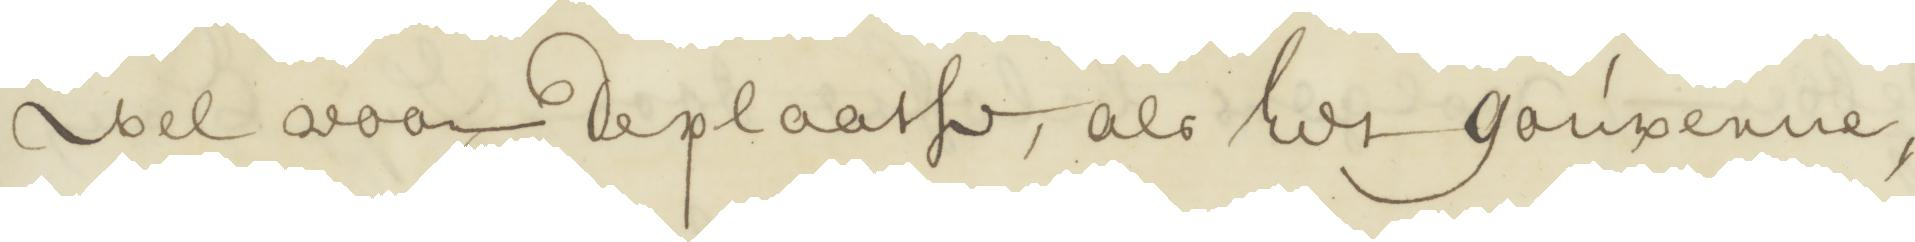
wel voor de plaatse, als het gouverne„
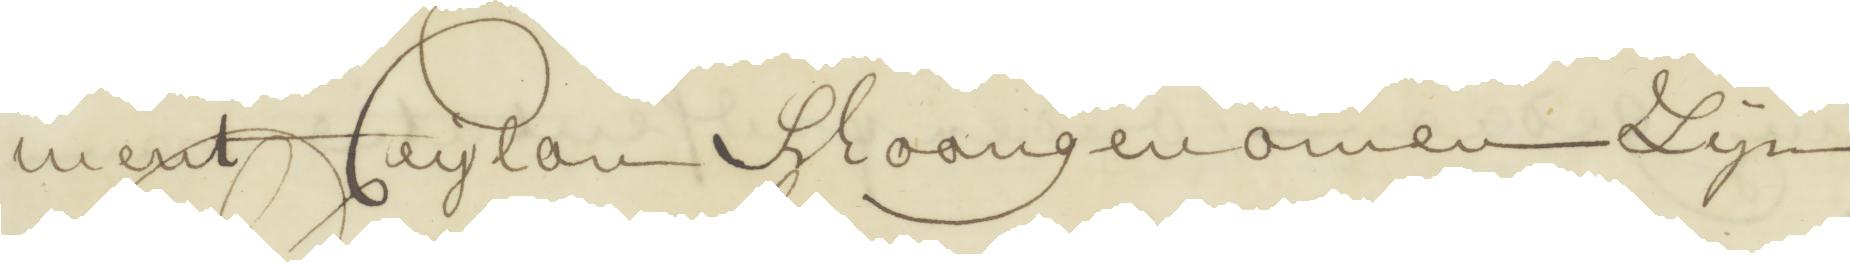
ment Ceijlon schoongenomen zijn
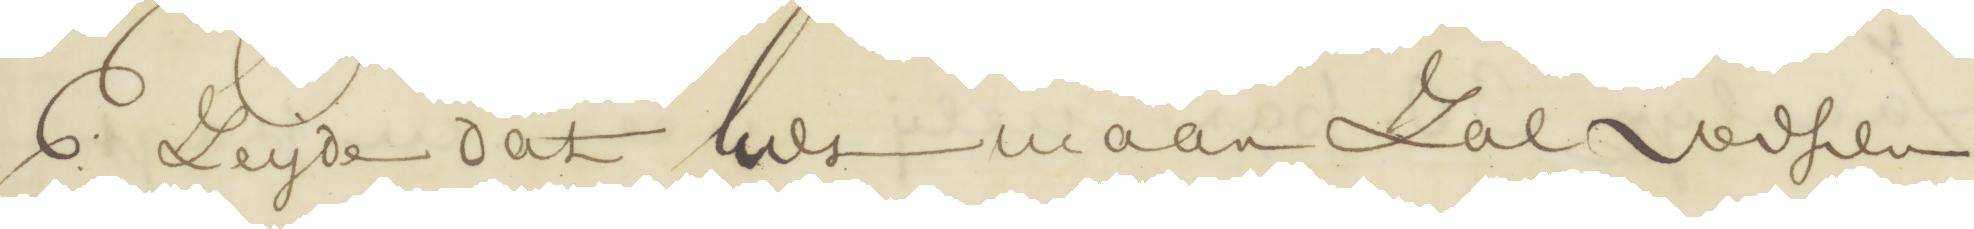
E: zeijde dat het maar zal wesen
